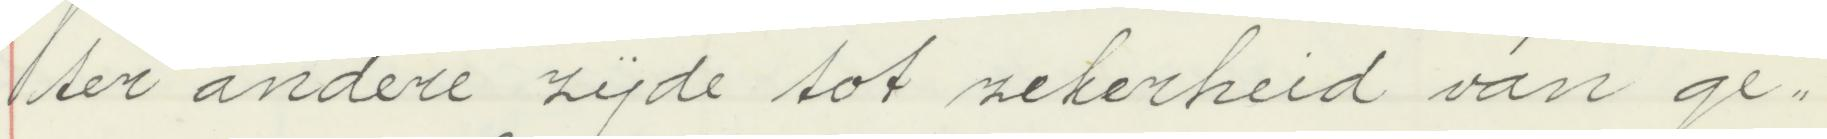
der andere zijde tot zekerheid van ge„
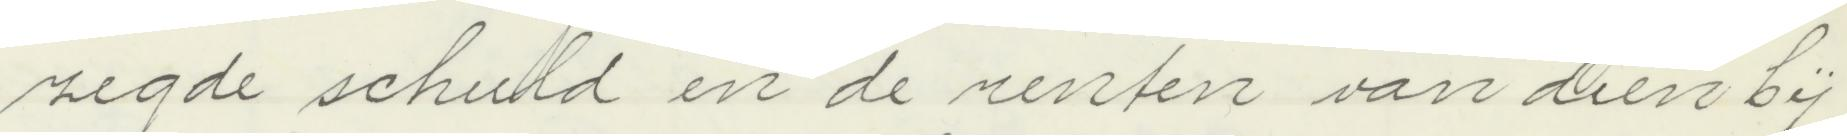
zegde schuld en de renten van dien bij
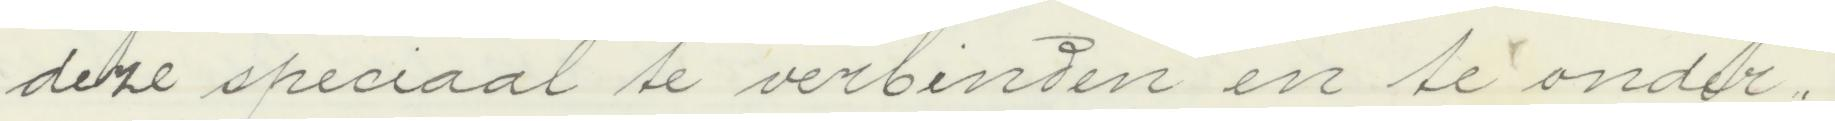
deze speciaal te verbinden en te onder„
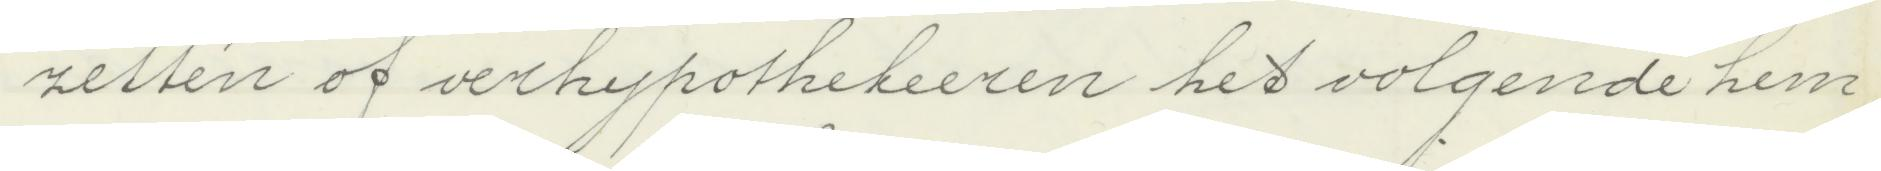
zetten of verhypothekeeren het volgende hem
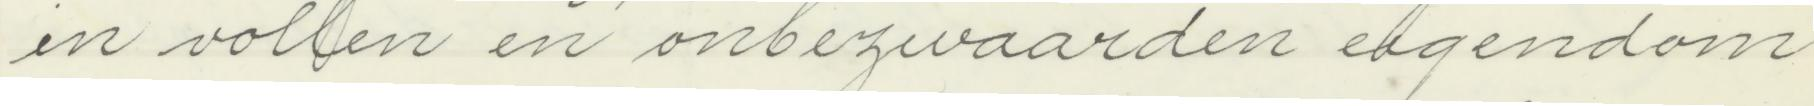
in vollen en onbezwaarden eigendom
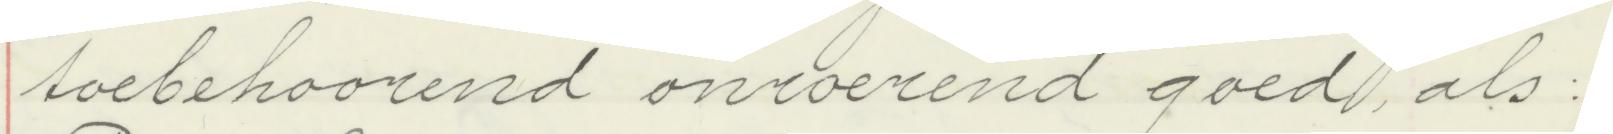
toebehoorend onroerend goed, als:
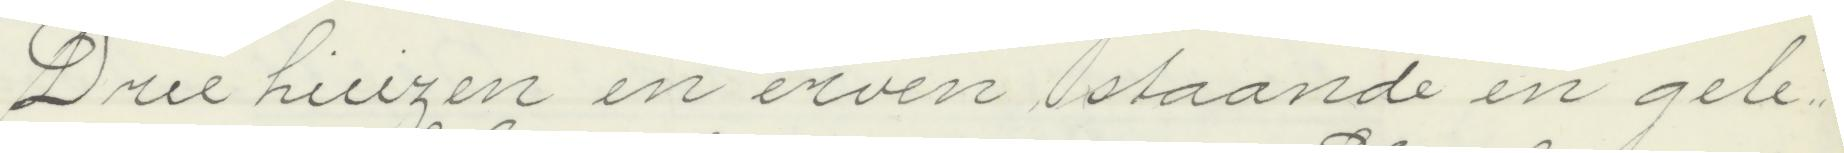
Drie huizen en erven staande en gele„
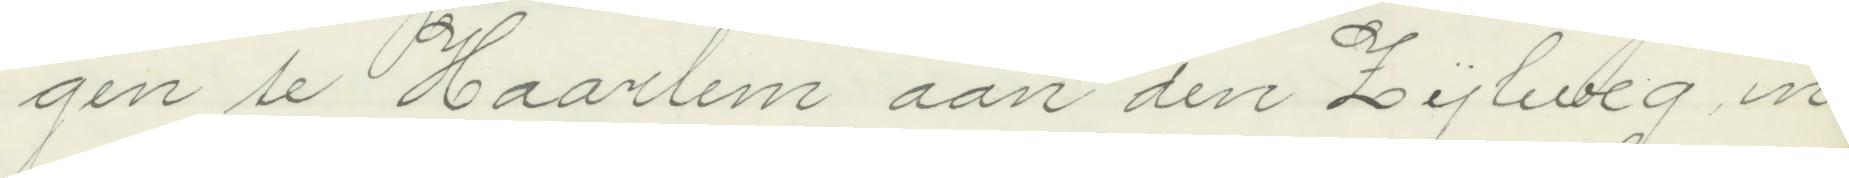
gen te Haarlem aan den Zijlweg, in
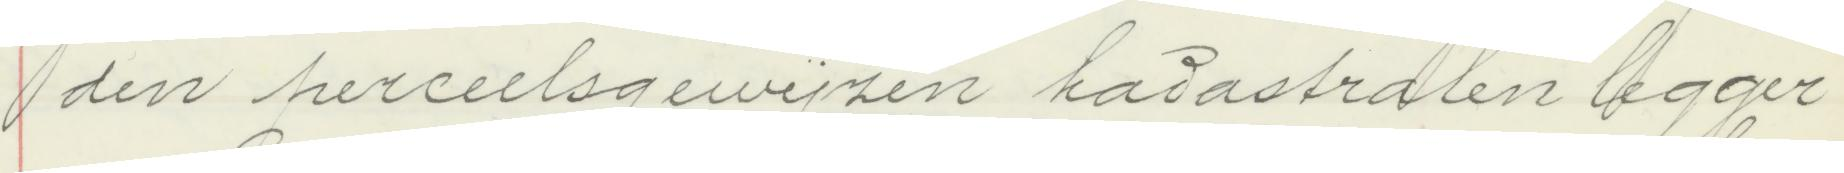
den perceelsgewijzen kadastralen legger
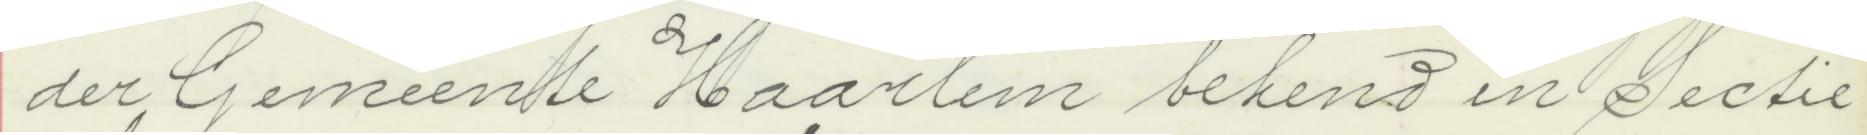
der Gemeente Haarlem bekend in sectie
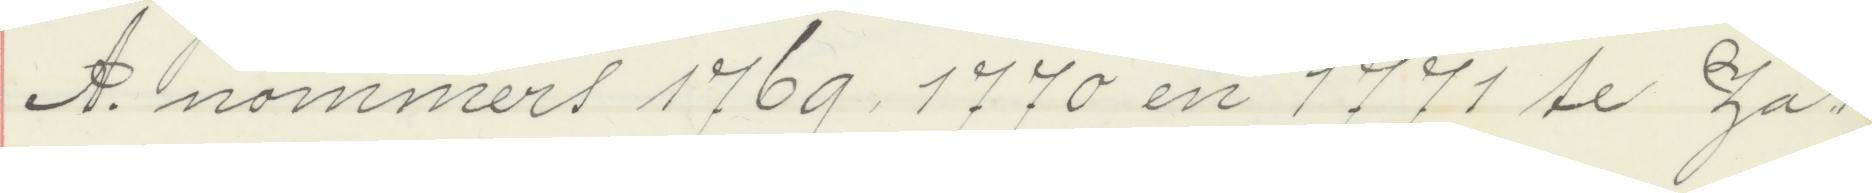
A. nommers 1769, 1770 en 1771 te Za„
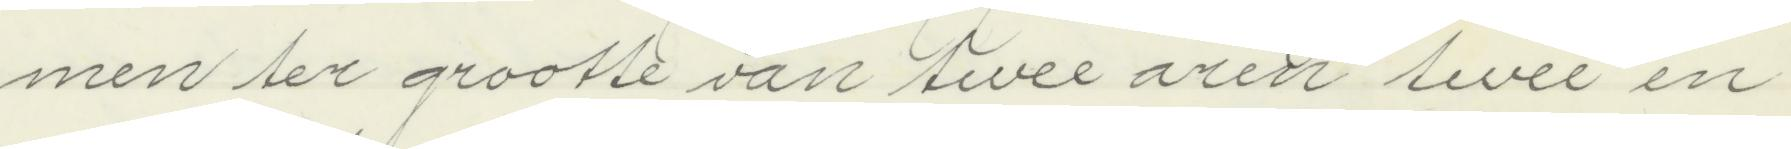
men ter grootte van twee aren twee en
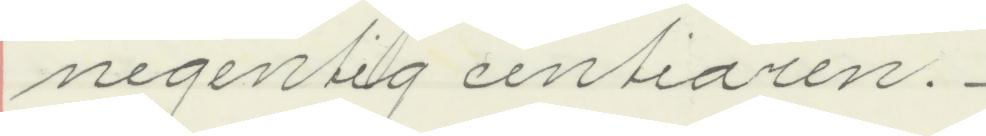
negentig centiaren.
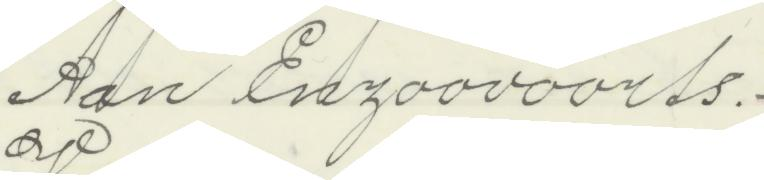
Aan Enzoovoorts.
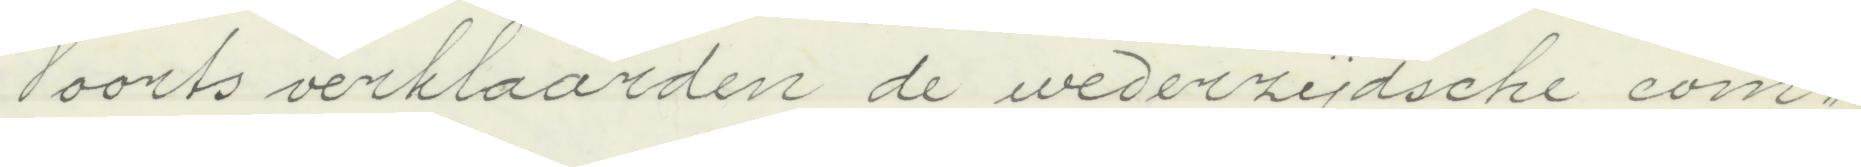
Voorts verklaarden de wederzijdsche com„
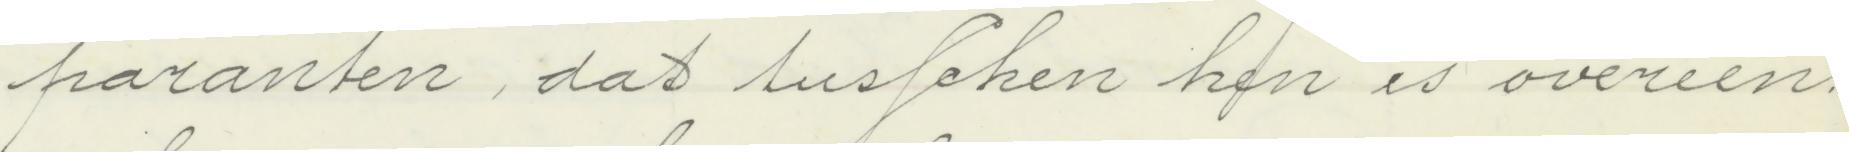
paranten, dat tusschen hen is overeen„
